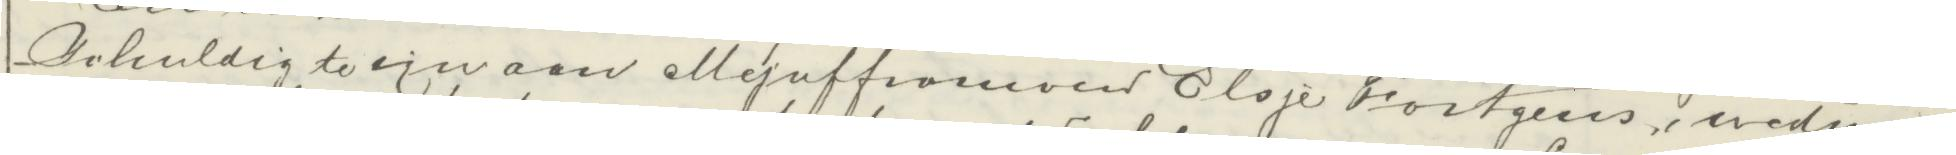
schuldig te zijn aan Mejuffrouw Elsje Fortgens, weduwe
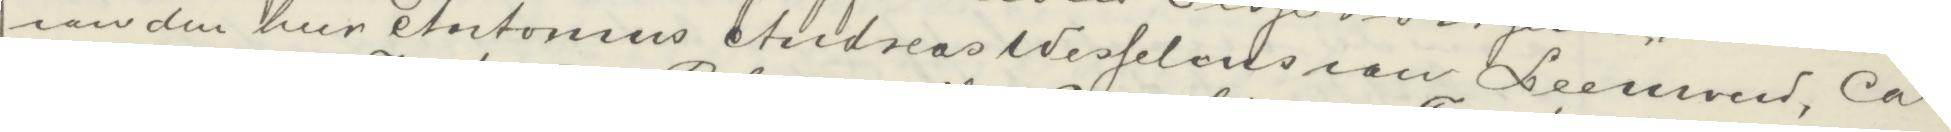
van den heer Antonius Andreas Wesselius van Leeuwen, Ca
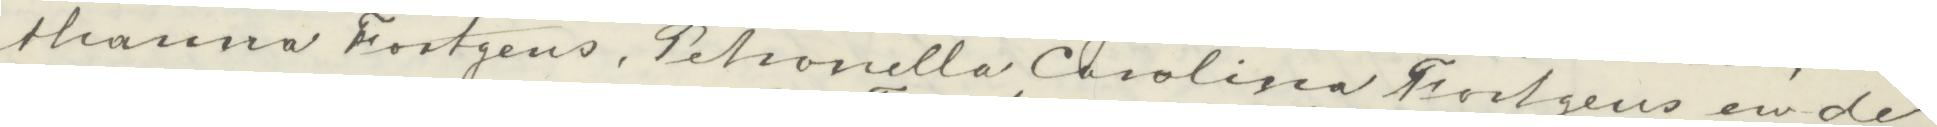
tharina Fortgens, Petonella Carolina Fortgens en de
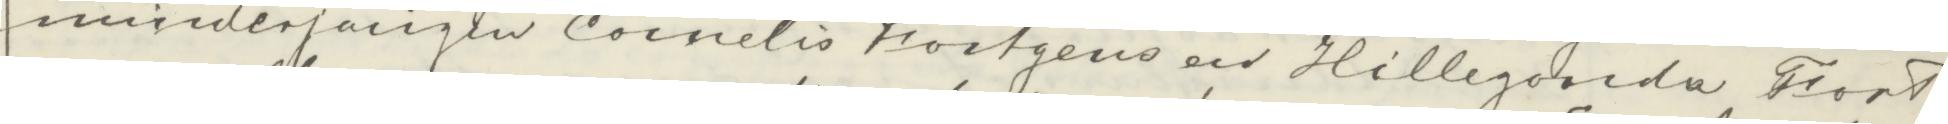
minderjarigen Cornelis Fortgens en Hillegonda Fort
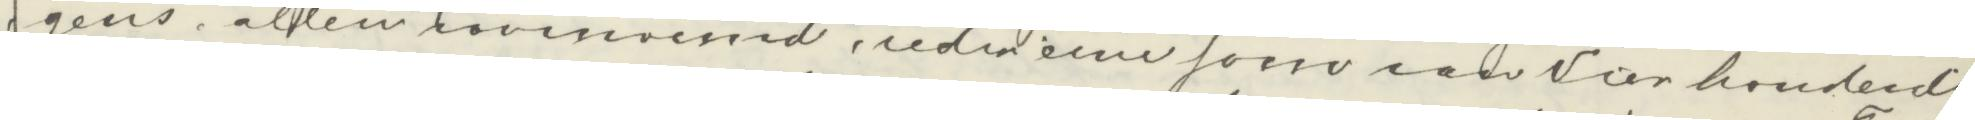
gens, allen voornoemd, ieder eene som van Vier honderd
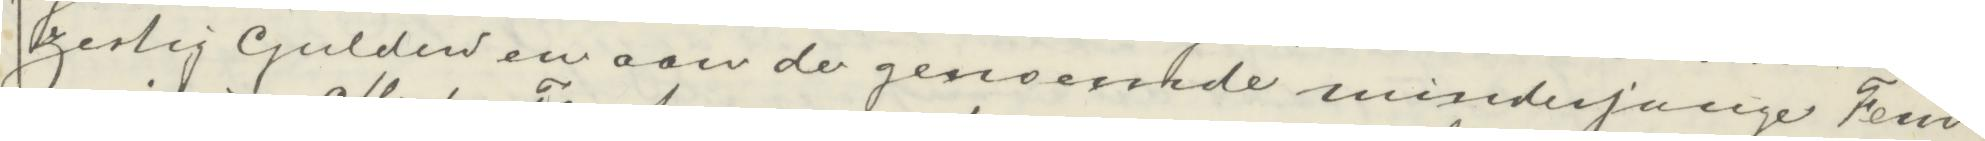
zestig Gulden en aan de genoemde minderjarige Fem
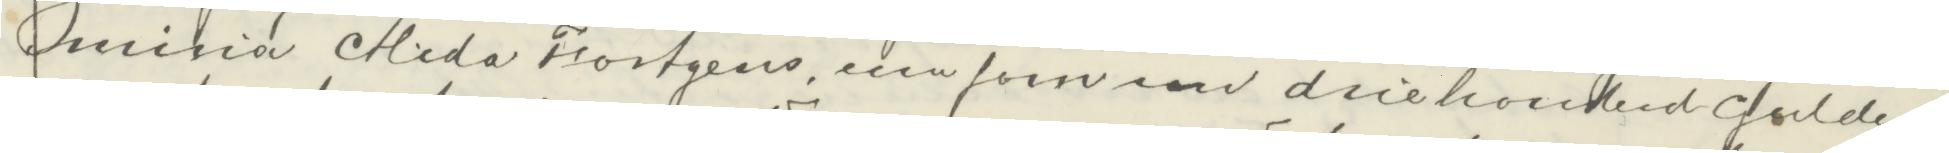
minia Alida Fortgens, een som van drie honderd Gulden
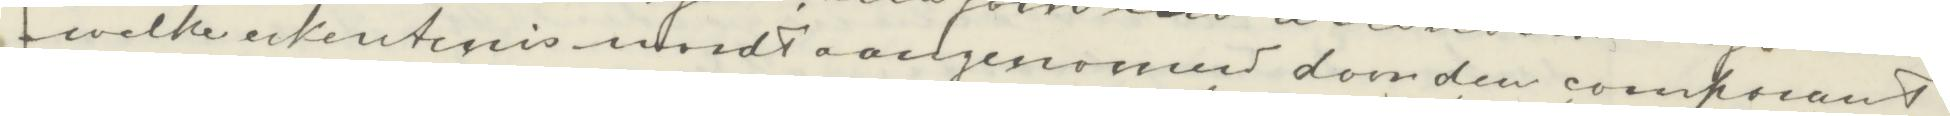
welke erkentenis wordt aangenomen door den comparant
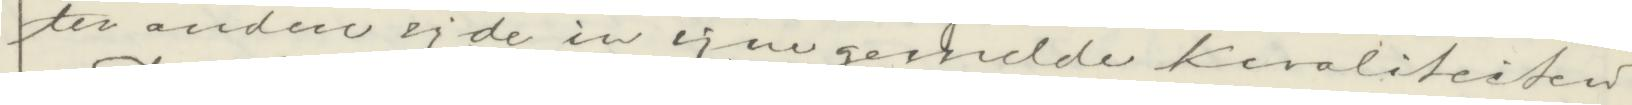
ter andere zijde in zijne gemelde kwaliteiten
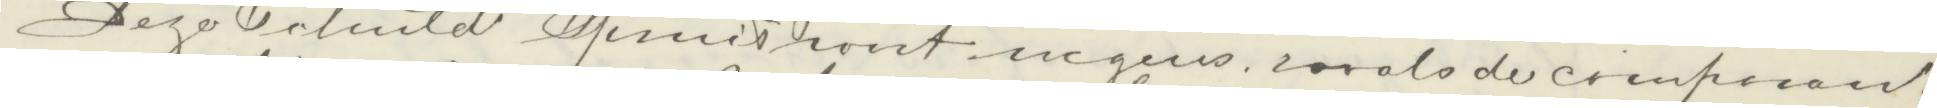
Deze schuld spruit voort wegens, zooals de comparant,
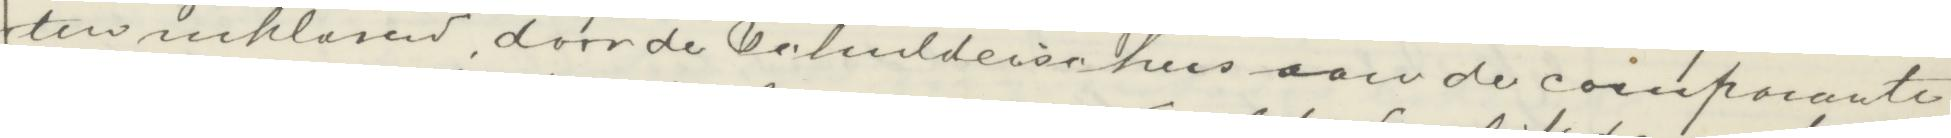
ten verklaren. door de schuldeischers aan de comparante
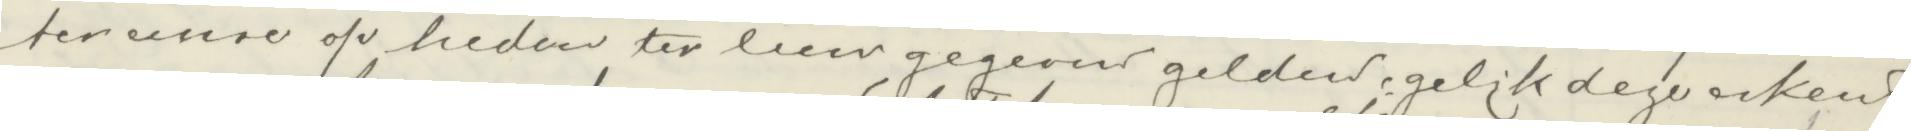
ter eenre op heden ter leen gegeven gelden, gelijk deze erkent
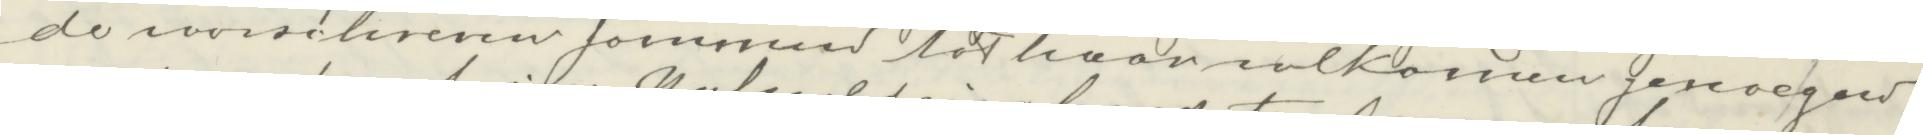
de voorschreven sommen tot haar volkomen genoegen
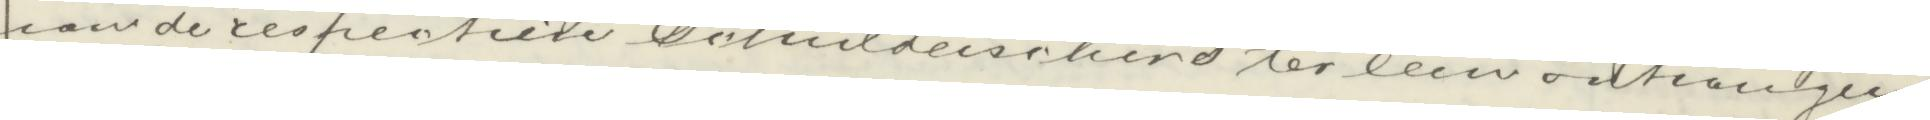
van de respectieve schuldeischers ter leen ontvangen
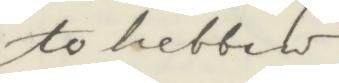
te hebben
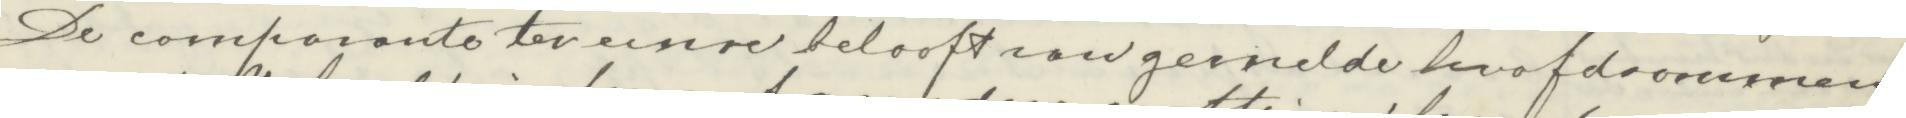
De comparante ter eenre belooft van gemelde hoofdsommen
